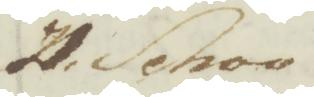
H. Schoo
